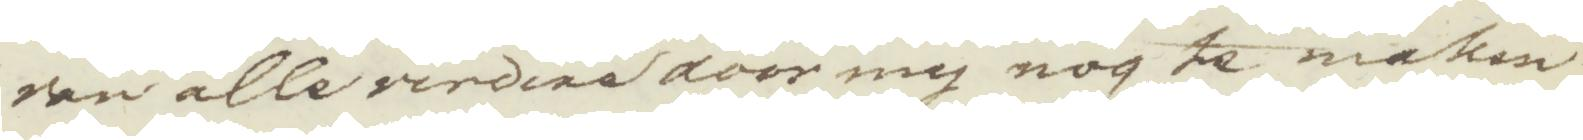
van alle verdere door my nog te maken
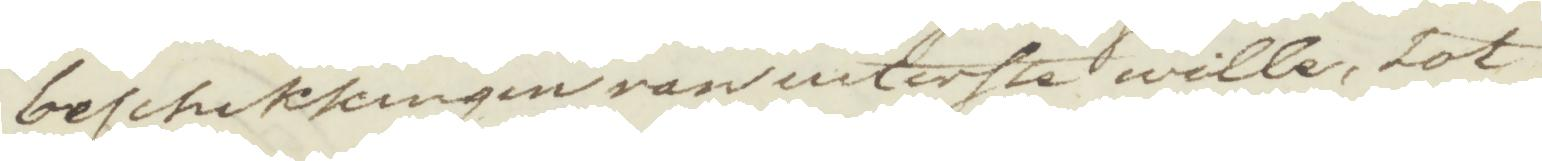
beschikkingen van uiterste wille, tot
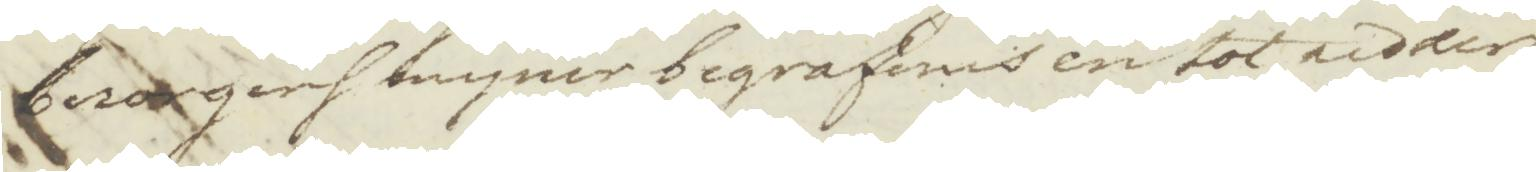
bezorgers myner begrafenis en tot redders
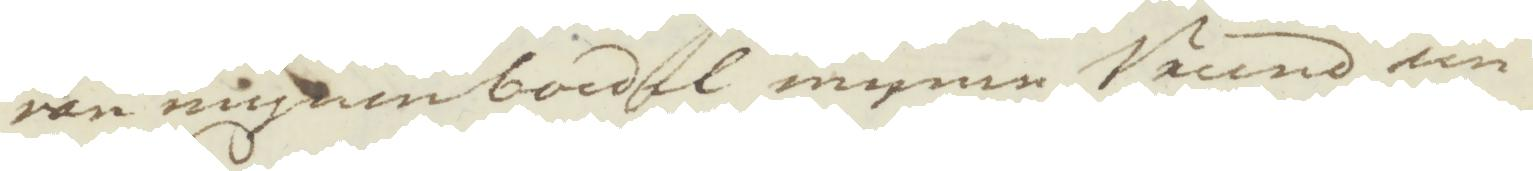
van mynen boedel mynen Vriend den
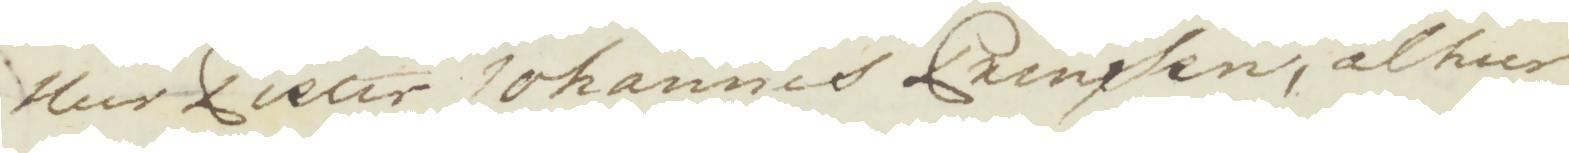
Heer Pieter Johannes Prinssen, alhier
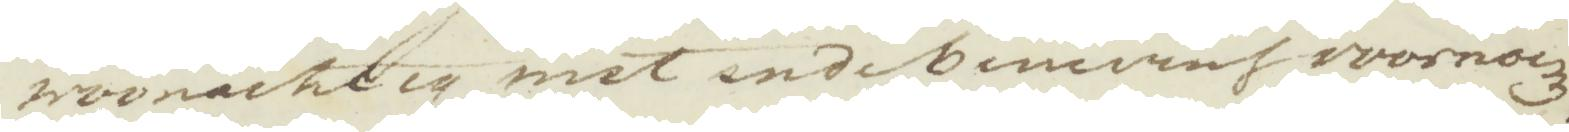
woonachtig met ende benevens voornoem„
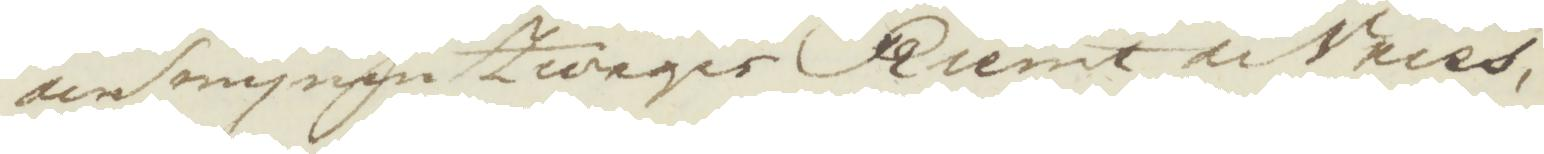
den mynen Zwager Riemt de Vries,
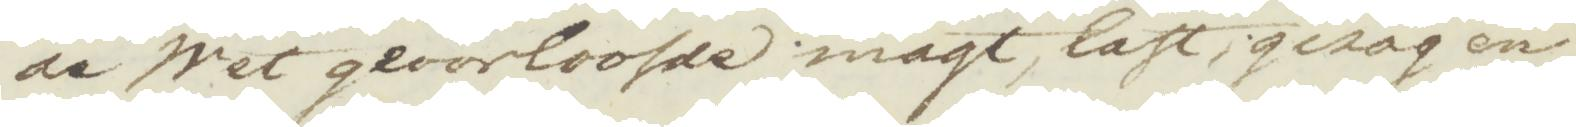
de Wet geoorloofde magt, last, gezag en
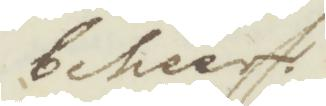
beheer.
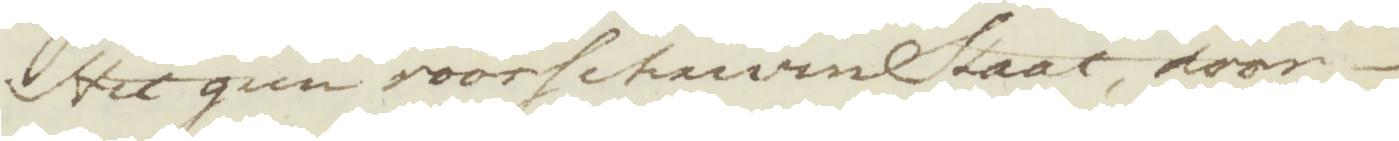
Hetgeen voorschreven Staat, door
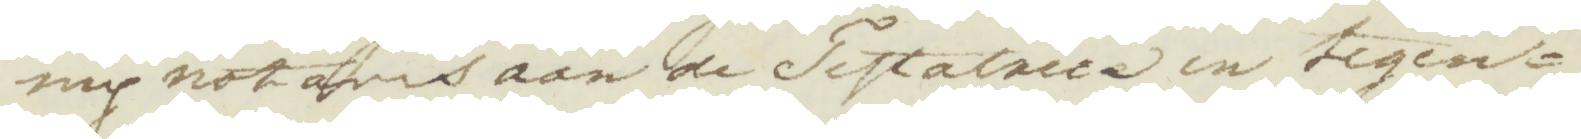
my notaris aan de Testatrice in tegen=
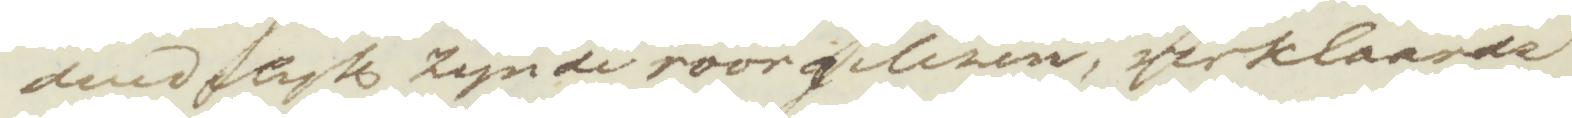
duidelyk zynde voorgelezen, verklaarde
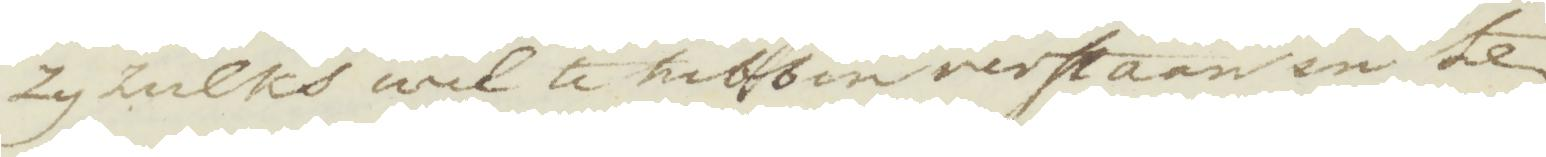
zy zulks wel te hebben verstaan en te
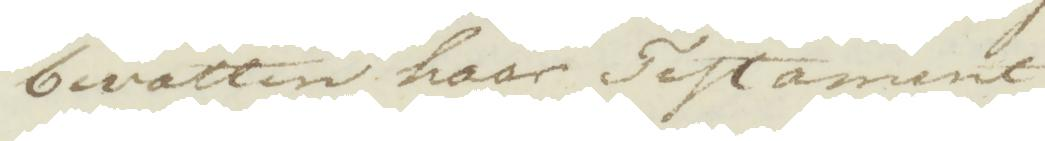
bevatten haar Testament
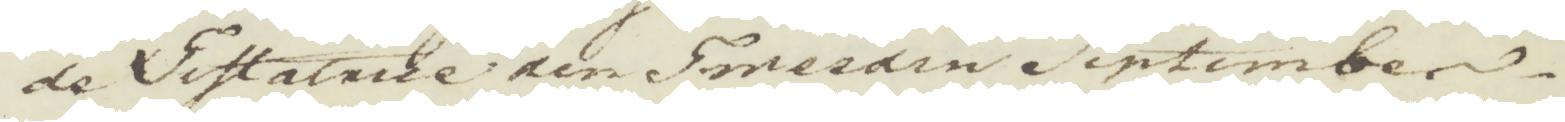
de Testatrice den Tweeden September
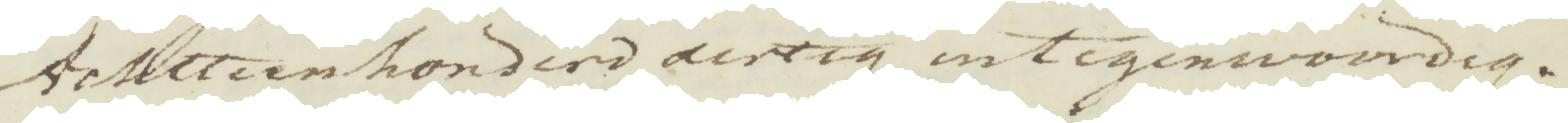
Achttienhonderd dertig in tegenwoordig„
